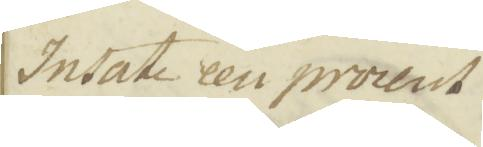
Insate een procent
